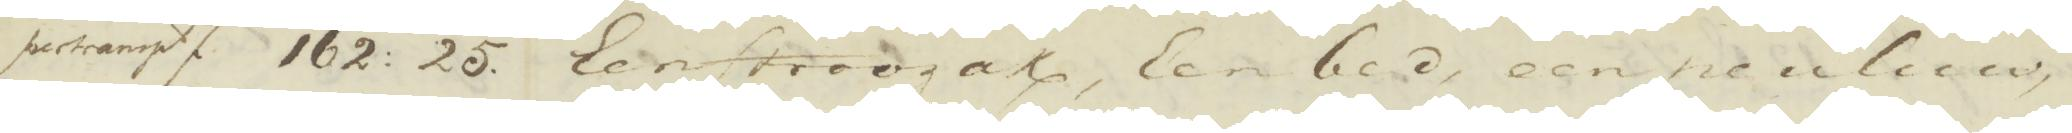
Per transport ƒ 162: 25. Een stroozak, Een bed, een peuluw,
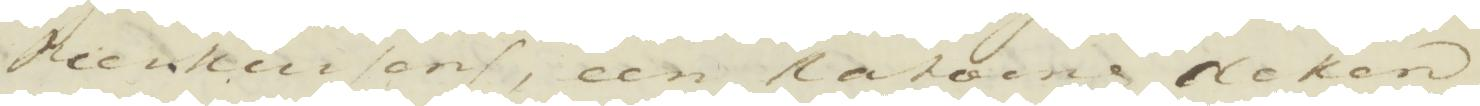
vier kussens, een catoene deken
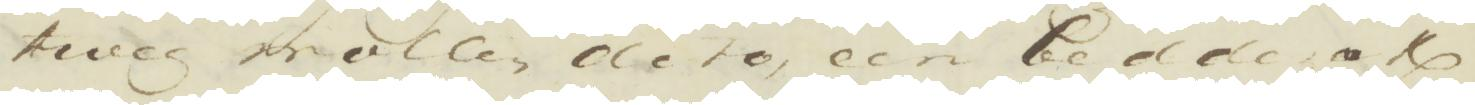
twee wollen dito, een beddezak
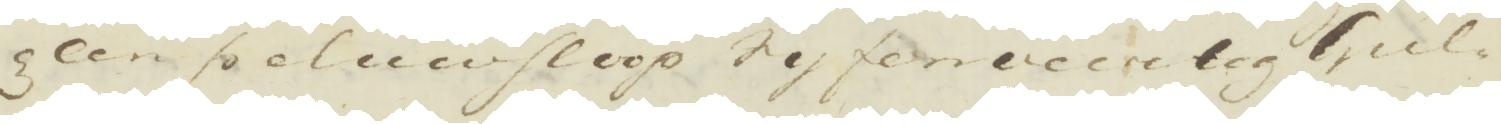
en een peluwsloop vyfenveertig Gul=
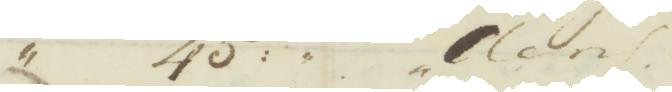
„ 45: „den
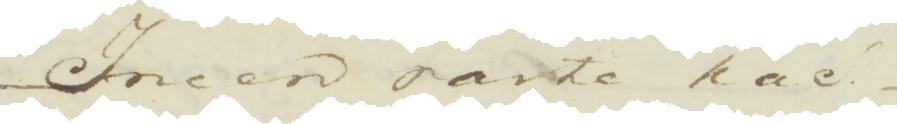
In een vaste kas.
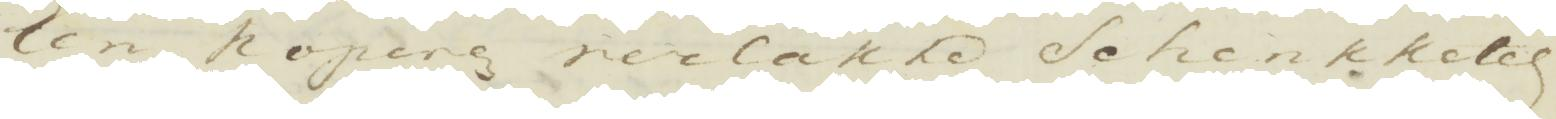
Een koperen verlakte schenkketel
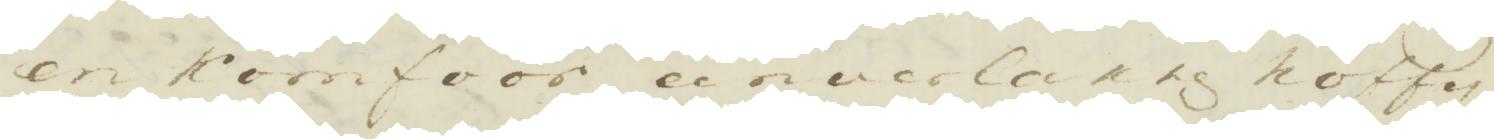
en komfoor, een verlakte koffy
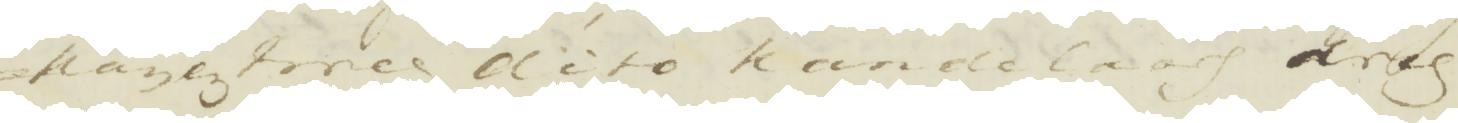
=kan en twee dito kandelaars drie
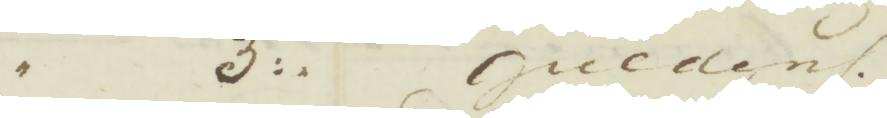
„ 3: „ Guldens.
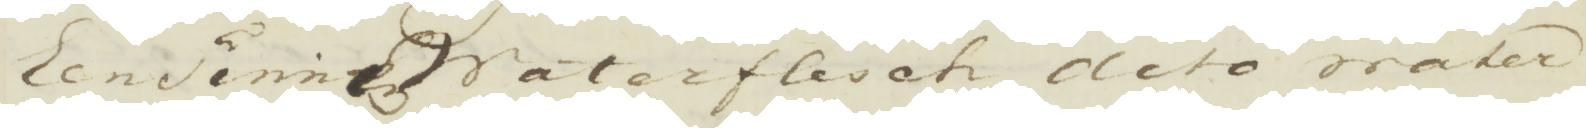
Een Tinnen Waterflesch, dito water
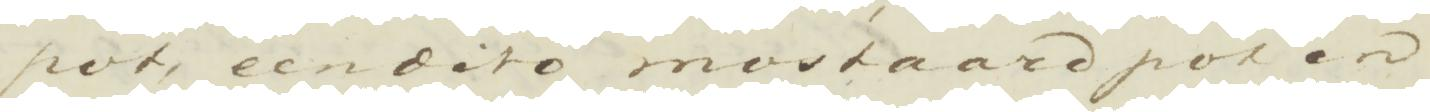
pot, een dito mostaard pot en
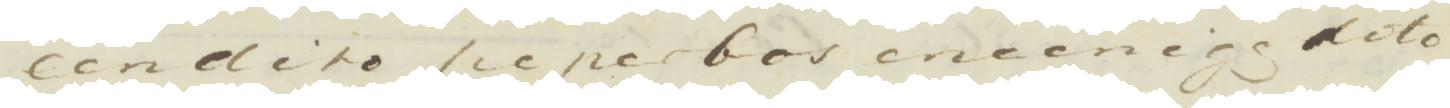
een dito peperbos en eenige dito
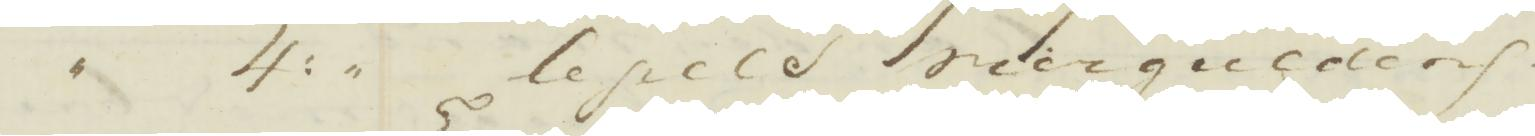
„ 4: „ lepels vier guldens
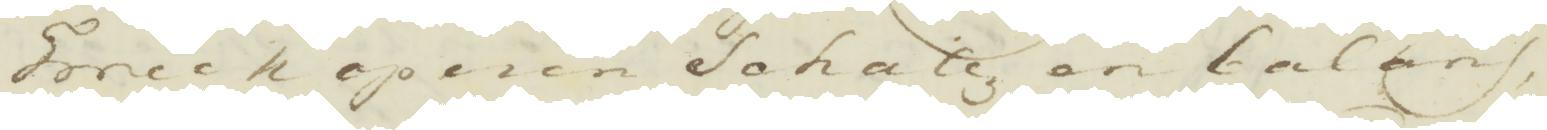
Twee koperen schalen en balans,
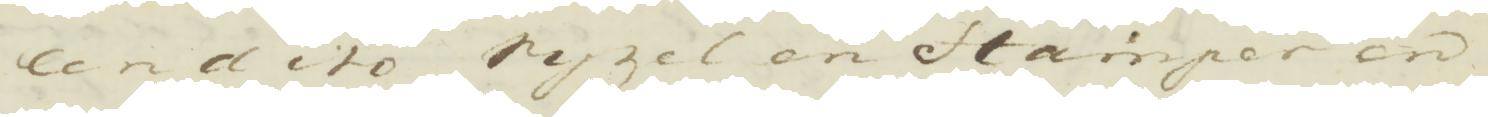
een dito vyzel en stamper en
